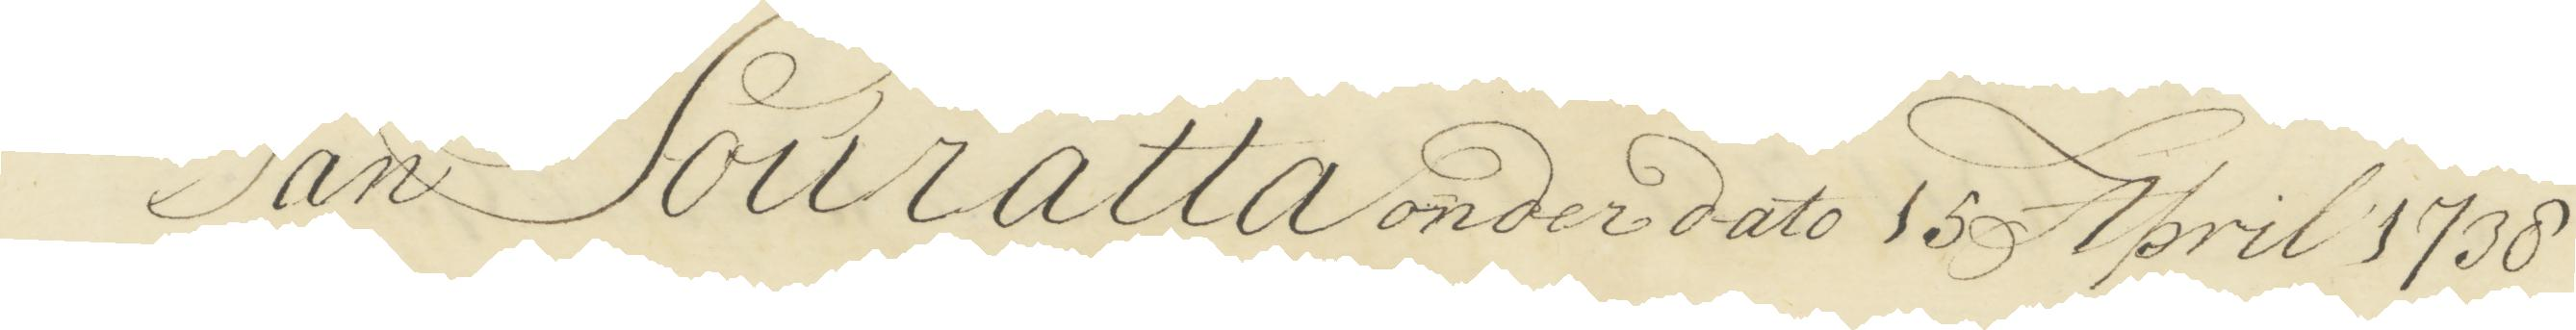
Van Souratta onder dato 15 April 1738
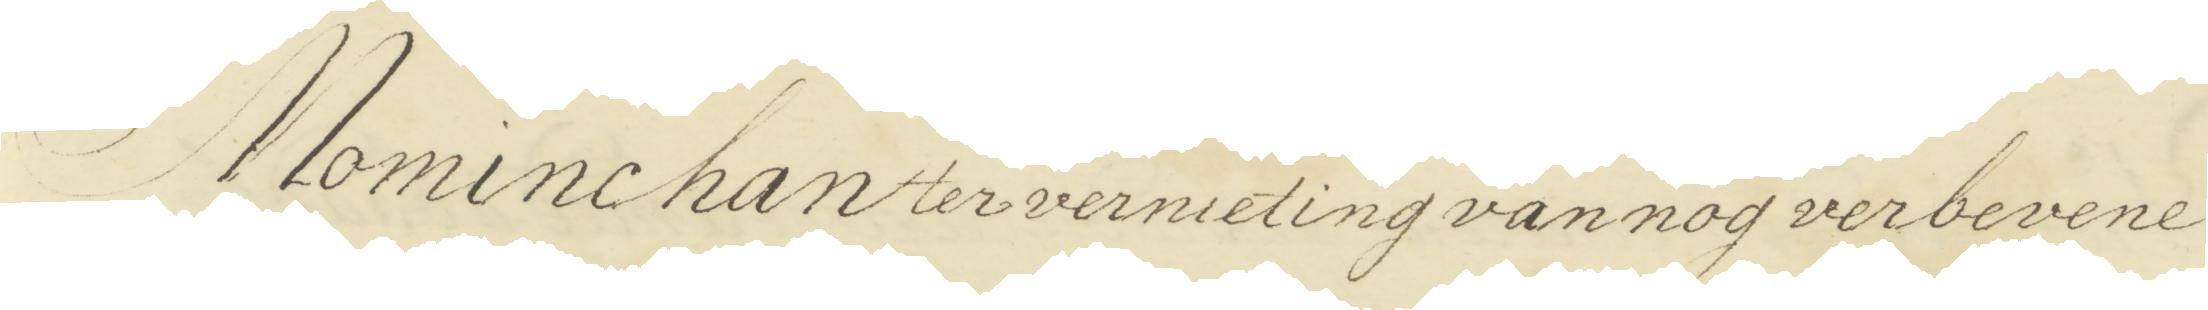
Mominchan ter vernieting van nog verbevene
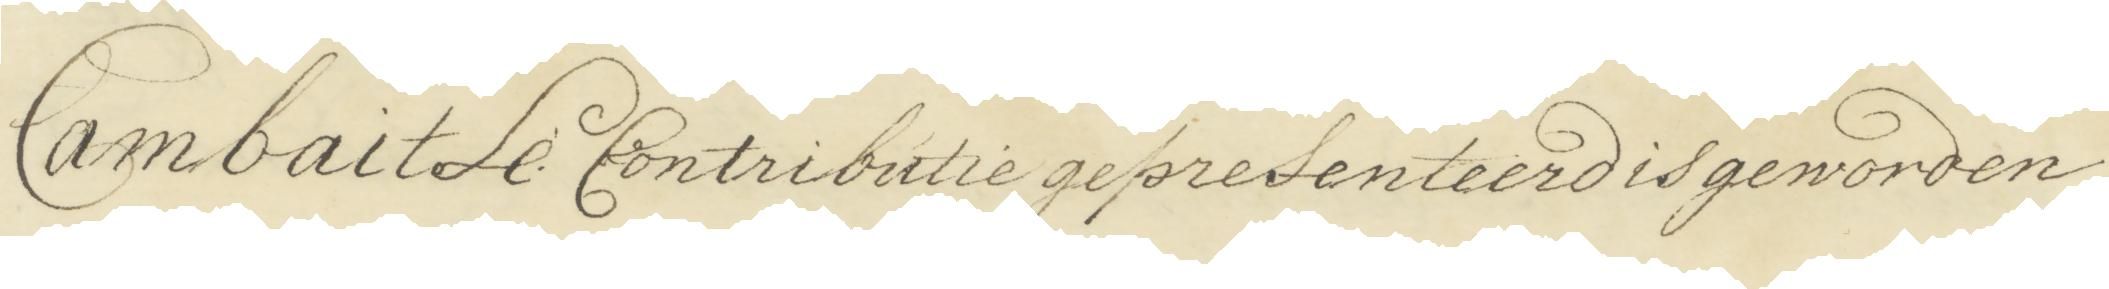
Cambaitse: Contributie gepresenteerd is geworden
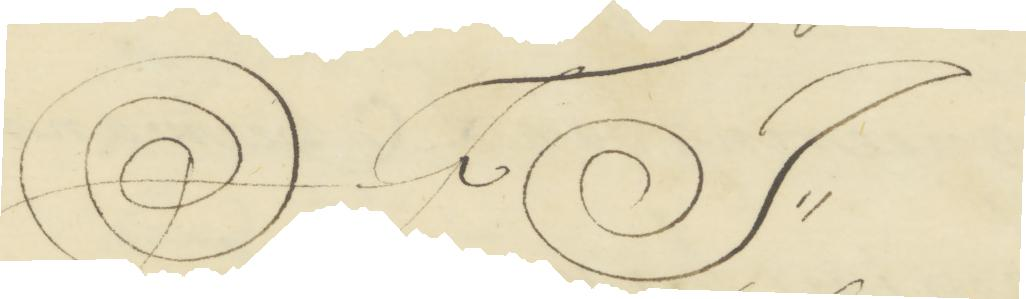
F I„
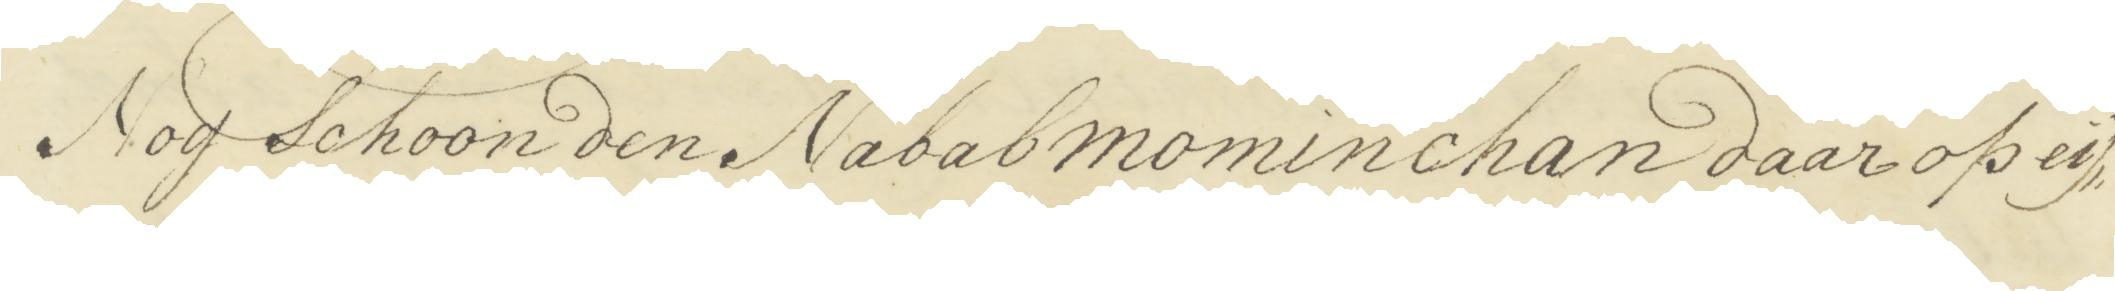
Nog schoon den Nabab mominchan daar op eij„
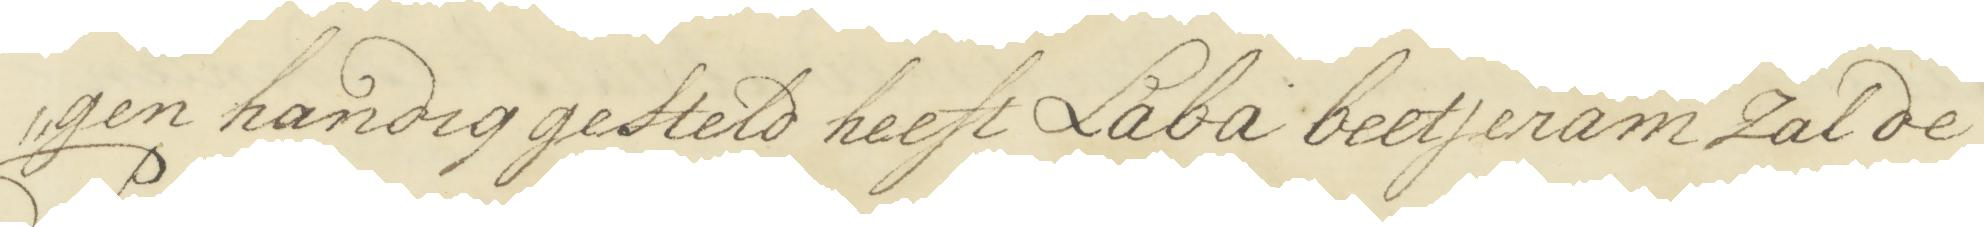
„gen handig gesteld heeft Laba beetjeram zal de
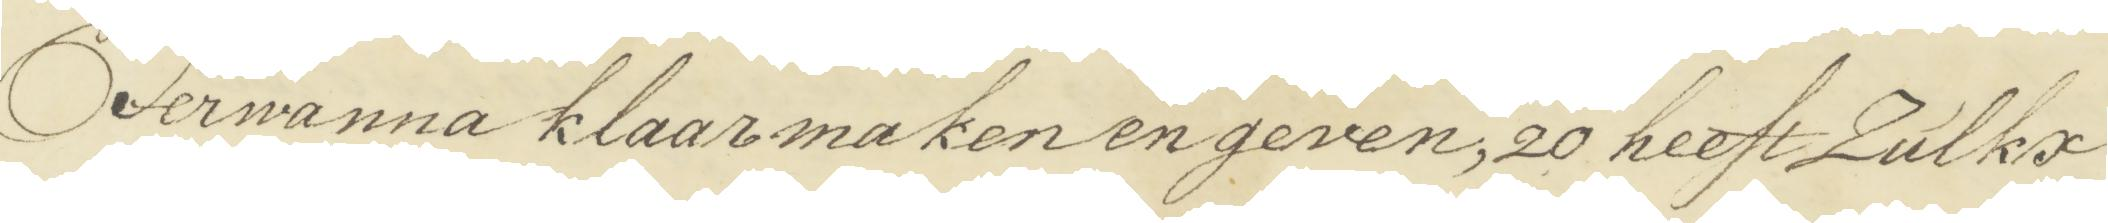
Perwanna klaar maken en geven, zo heeft zulkx
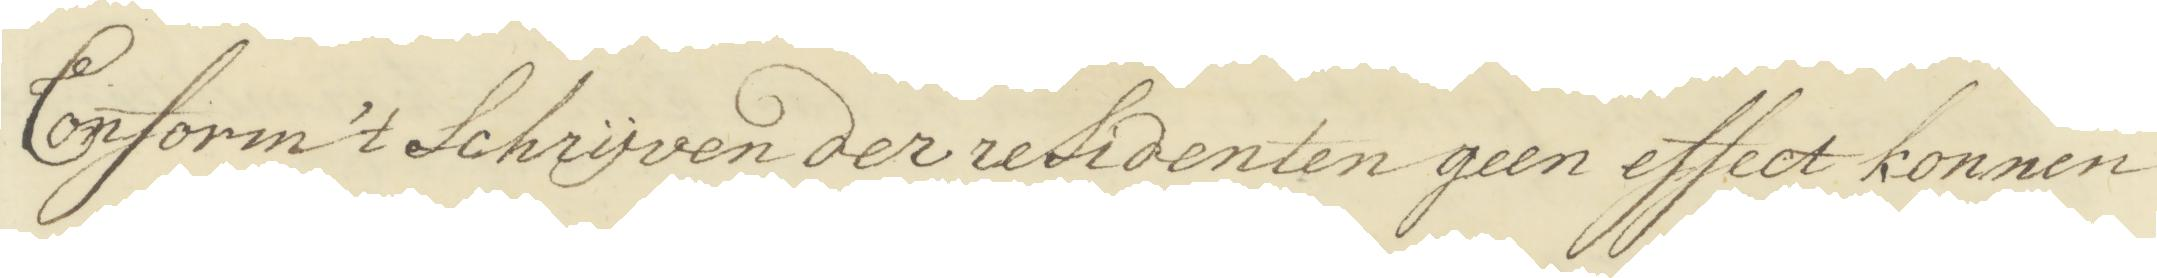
Conform ’t schrijven der residenten geen effect konnen
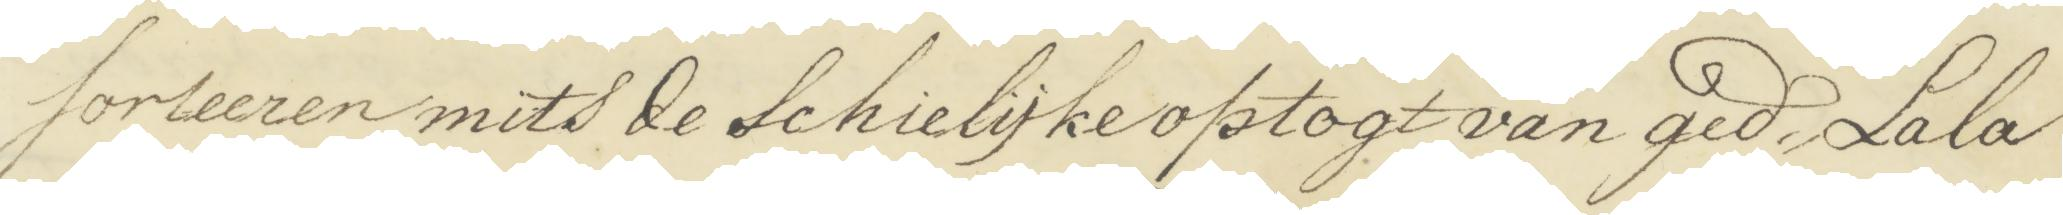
sorteeren mits de schielijke optogt van ged„ Lala
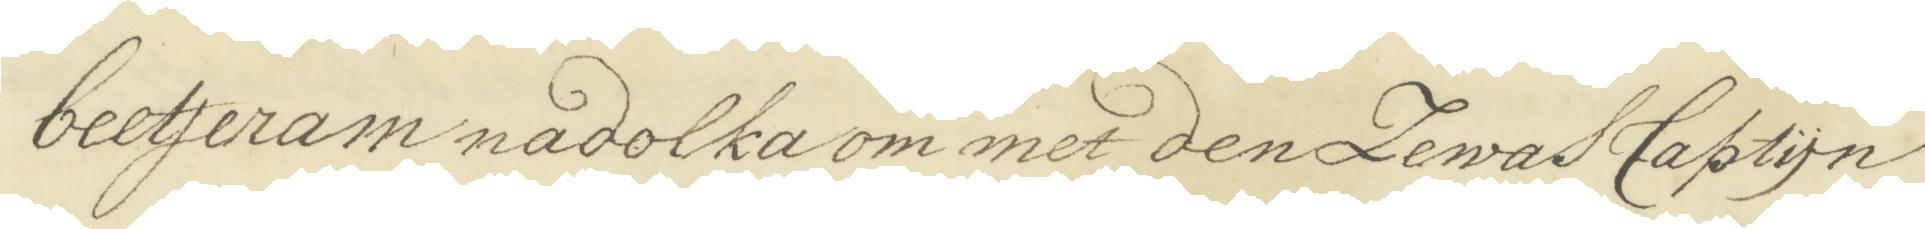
beetjeram nadolka om met den Zewas Captijn
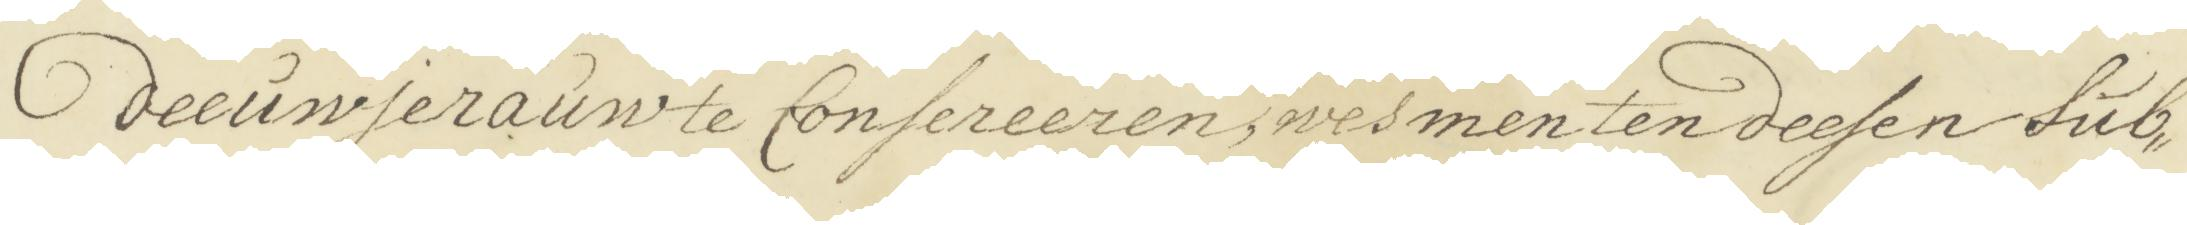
deeuwjerauw te Consereeren, wes men ten deesen sub„
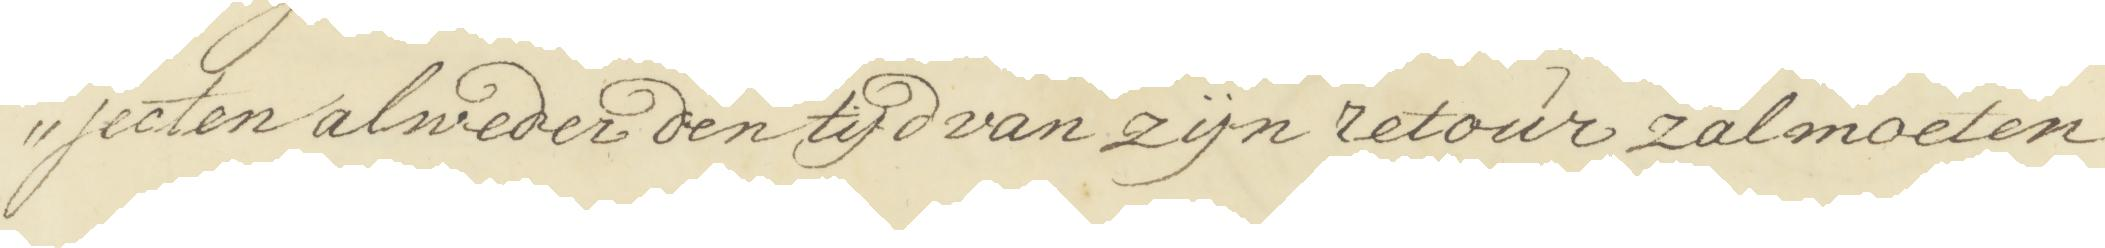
„jecten alweder den tijd van zijn retour zal moeten
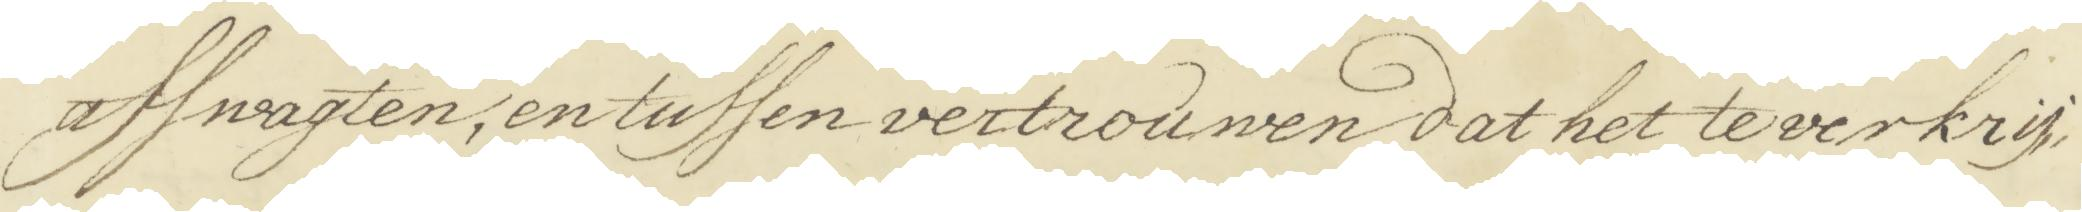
affwagten, en tussen vertrouwen dat het te verkrij„
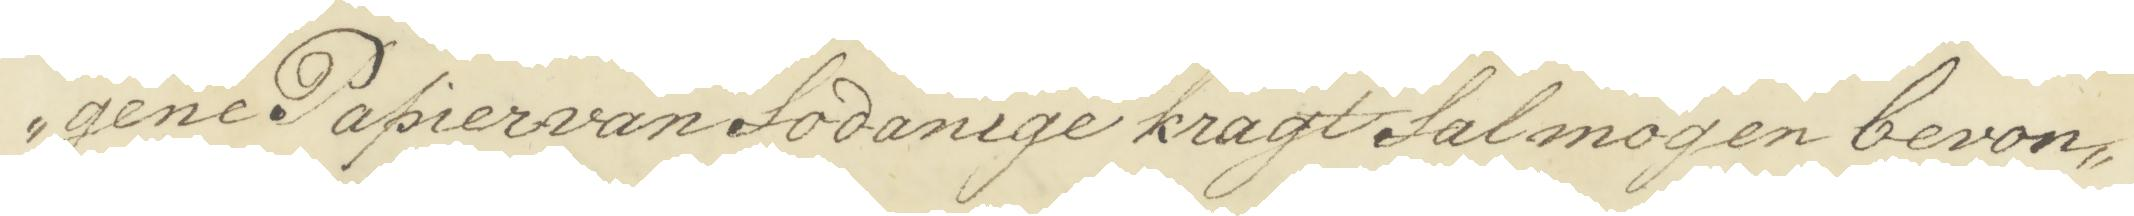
„gene Papier van sodanige kragt sal mogen bevon„
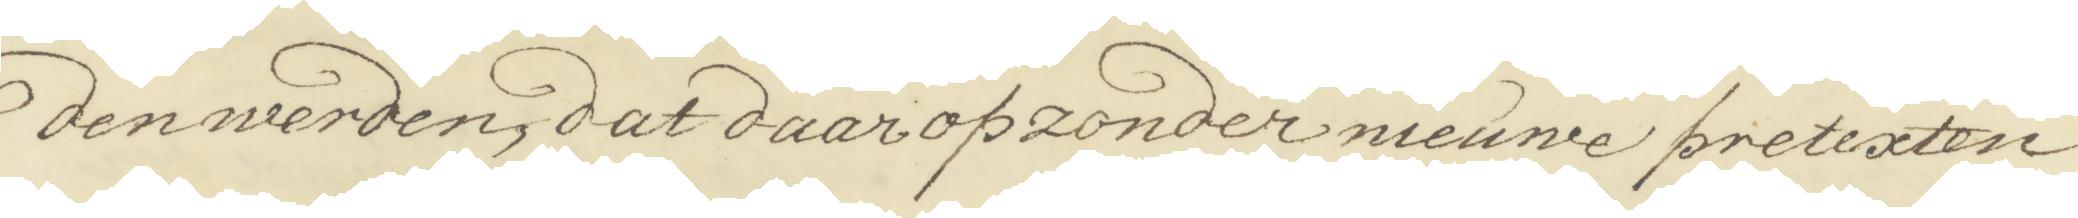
den werden, dat daar op zonder nieuwe pretexten
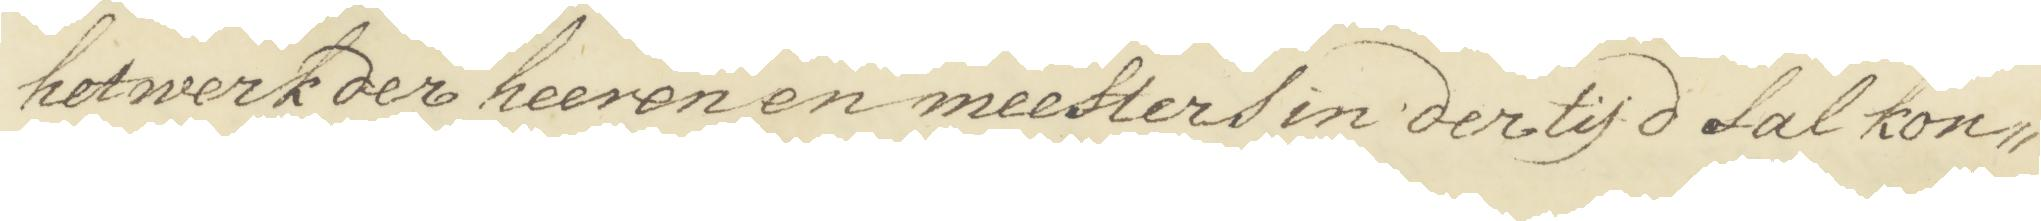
het werk der heeren en meesters in der tijd sal kon„
